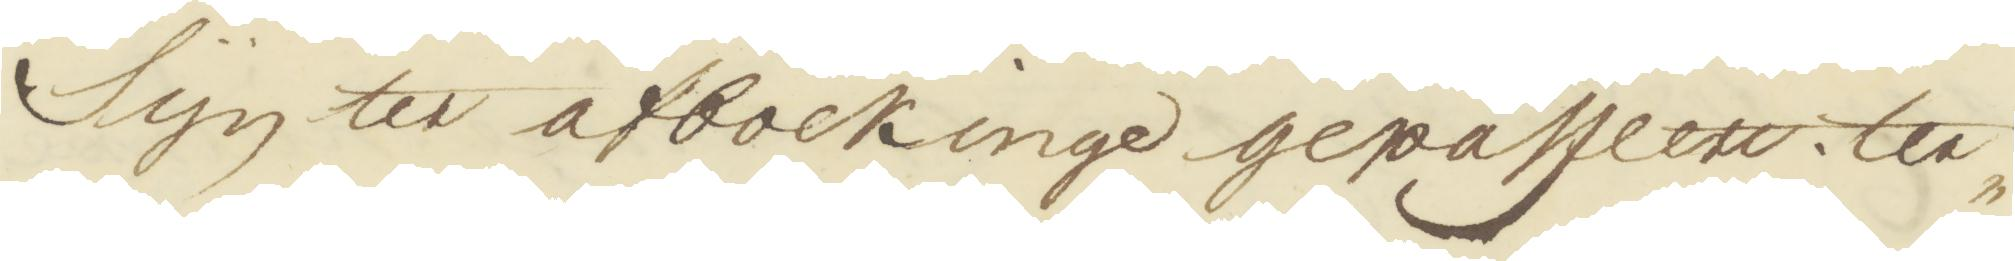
sijn ter afboekinge gepasseert, ter„
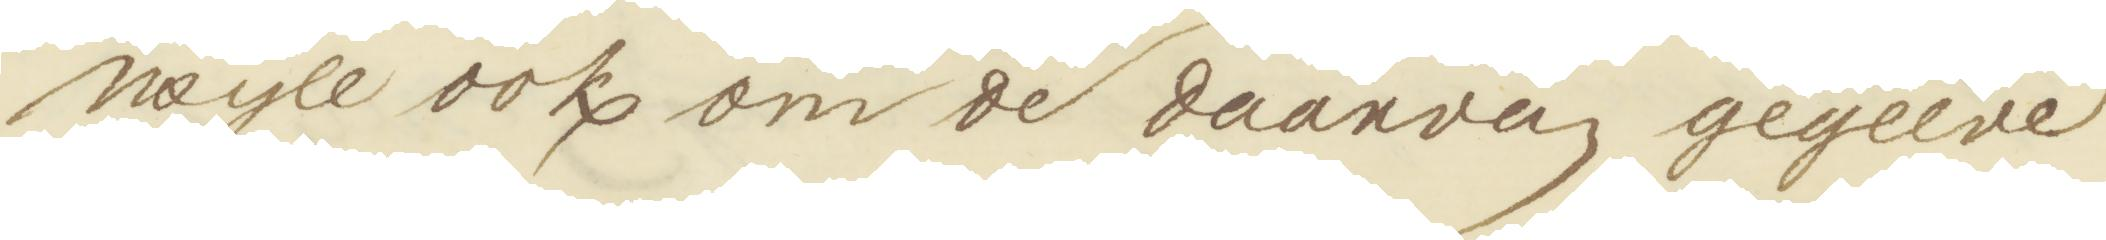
wijle ook om de daarvan gegeeve
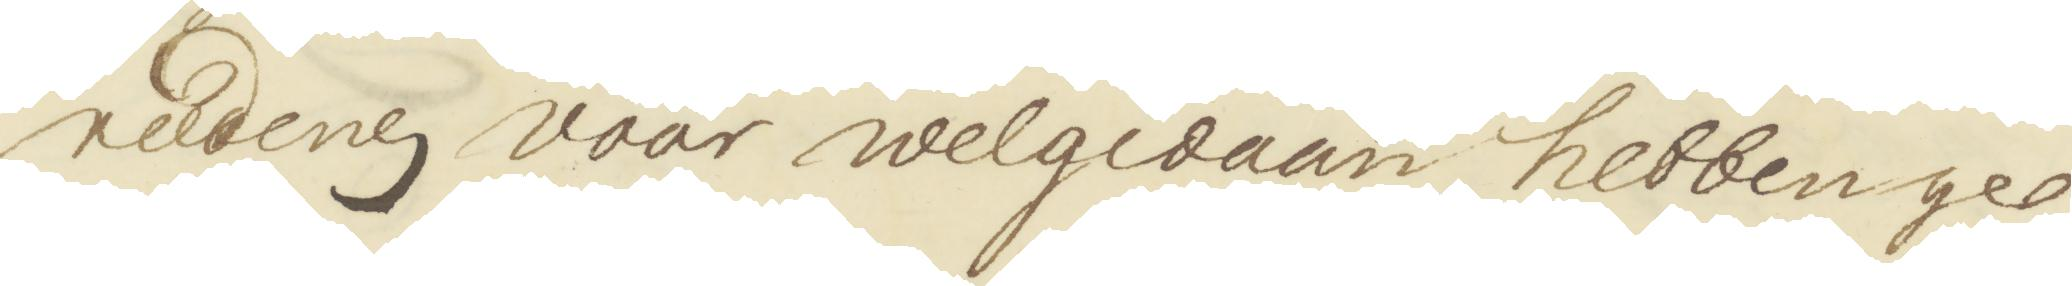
reedenen voor welgedaan hebben ge
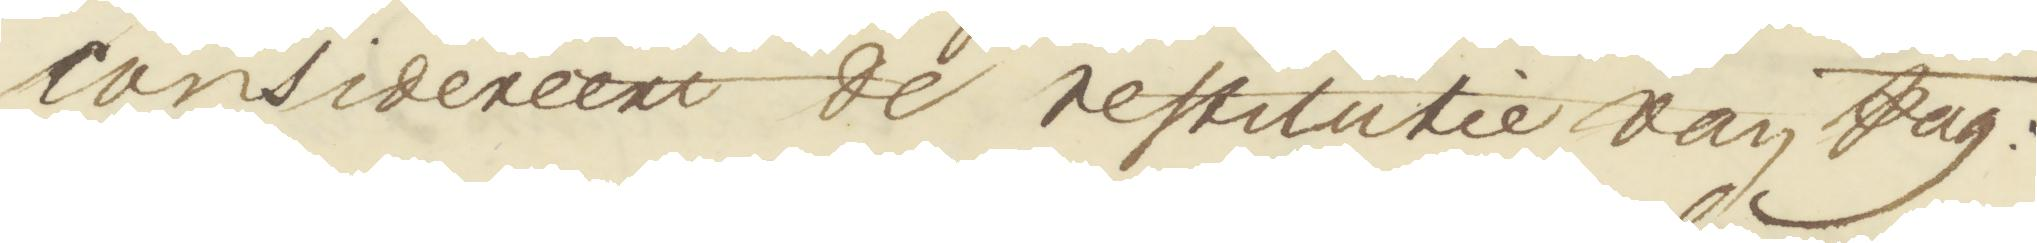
considereert de restitutie van pag:
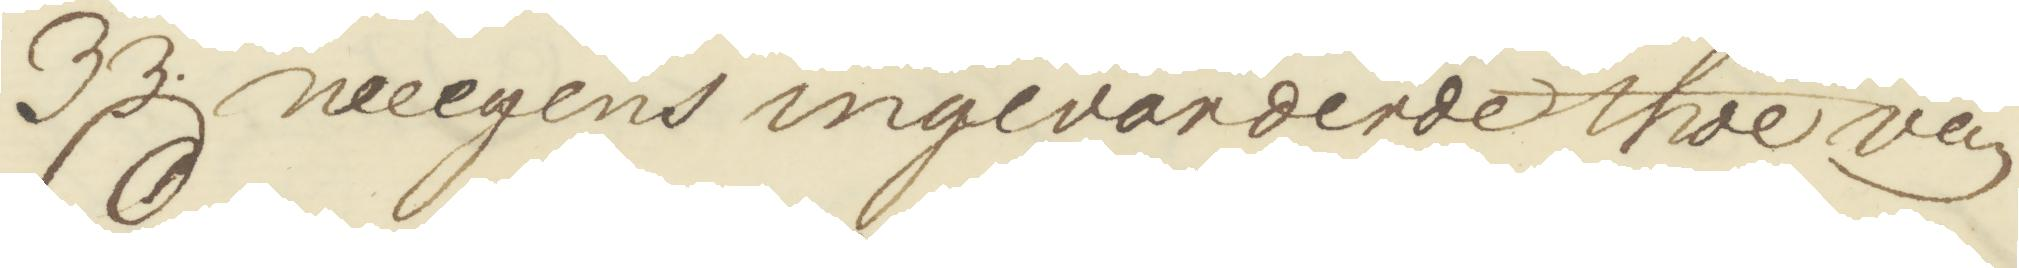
33: weegens ingevorderde thol van
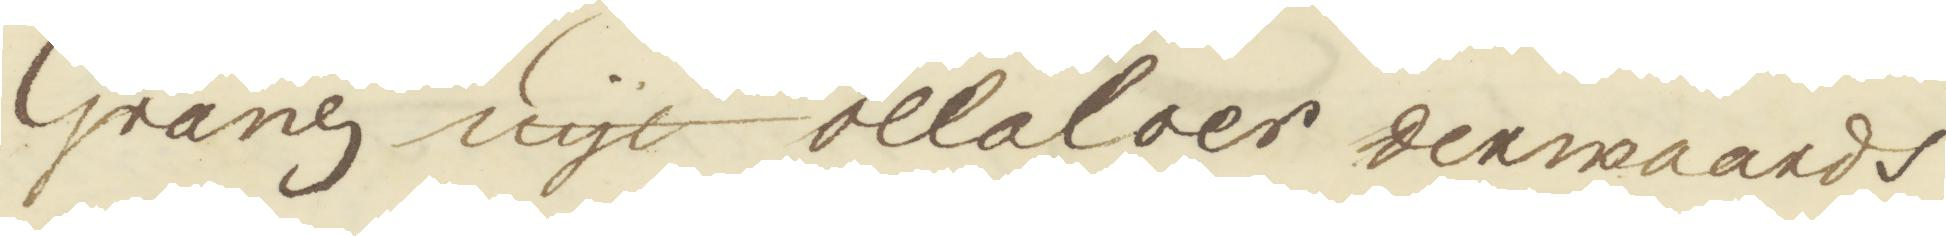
Granen uijt ollaloer derwaards
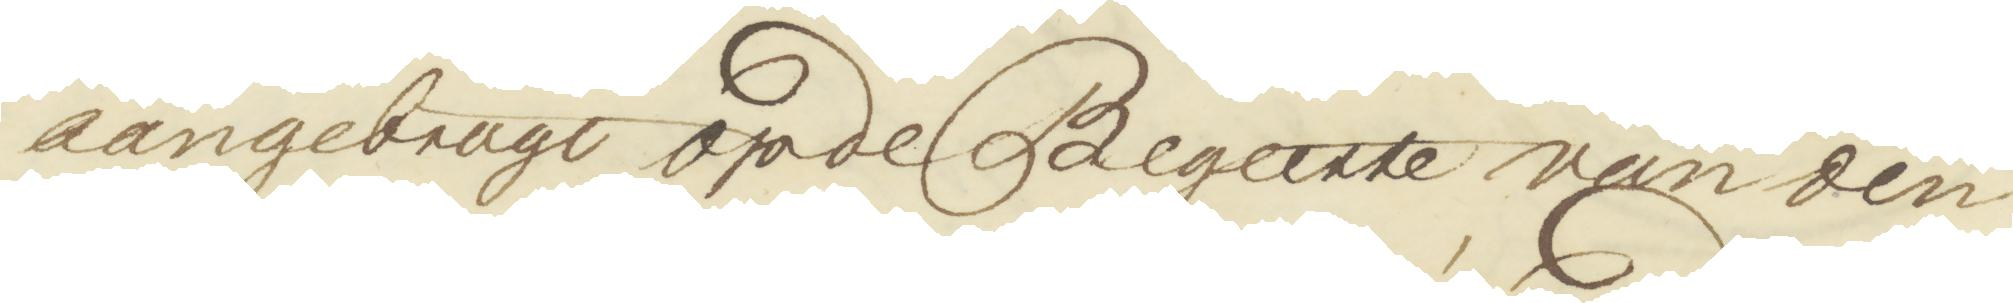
aangebragt opde Begeerte van den
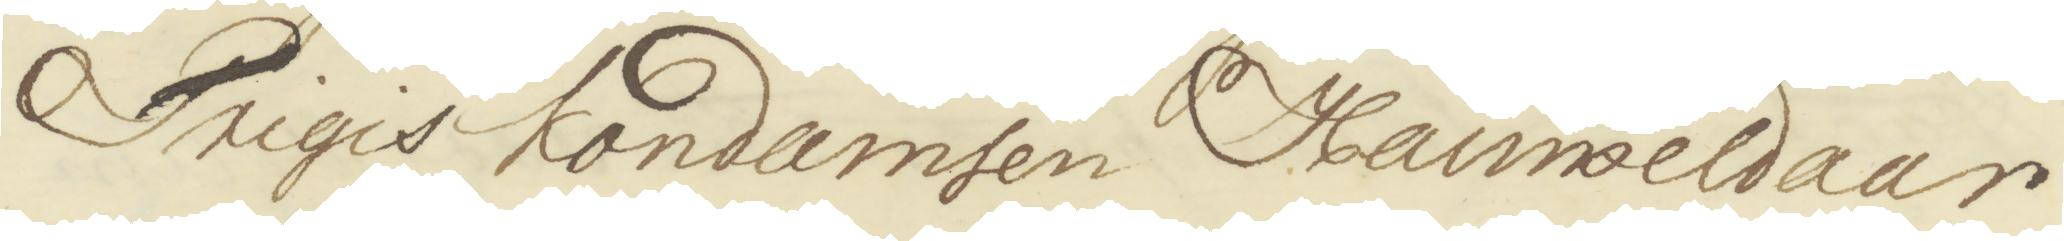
Prigis kondamsen Hauweldaar
